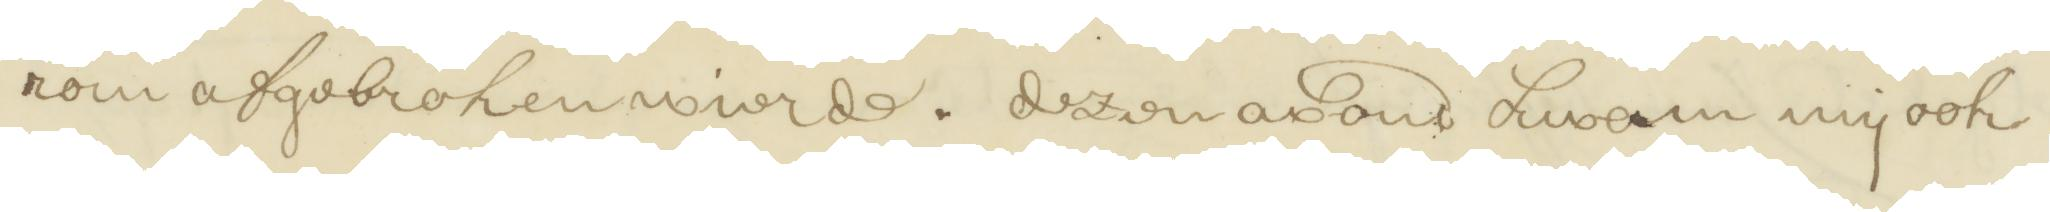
rom afgeboken wierde. dezen avond kwam mij ook
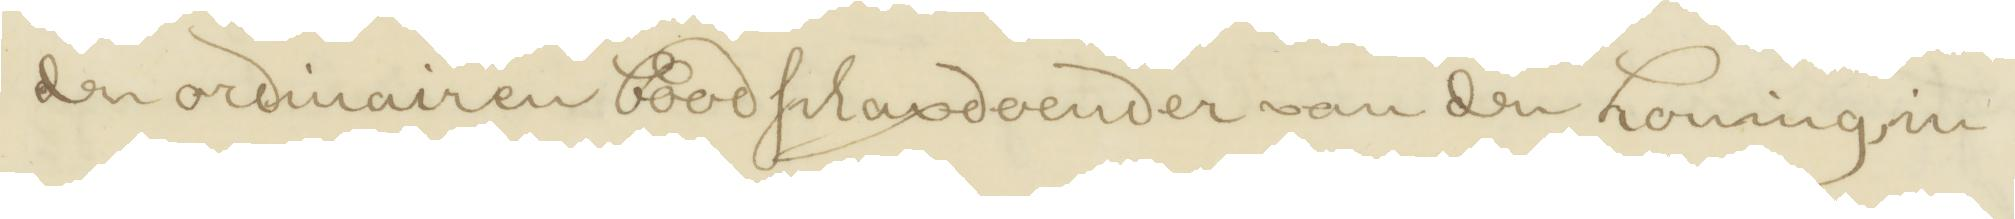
den ordinairen boodschapdoender van den koning, in
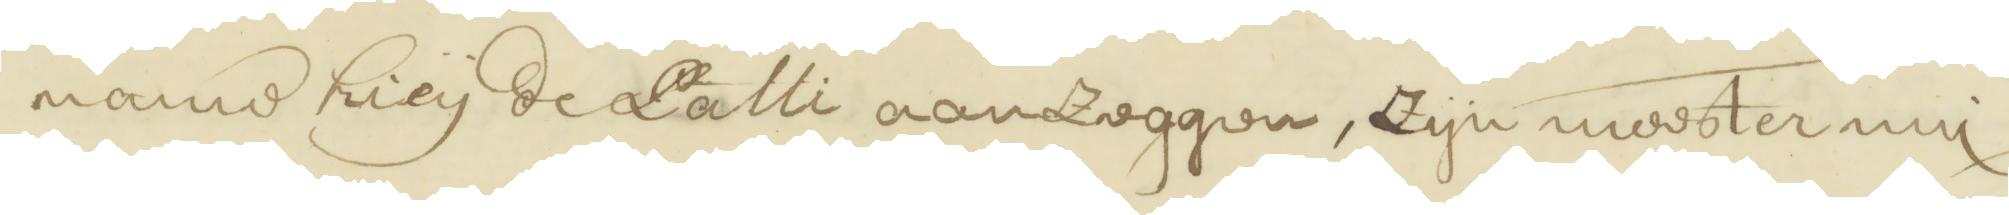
name kieij de Patti aanzeggen, zijn meester mij
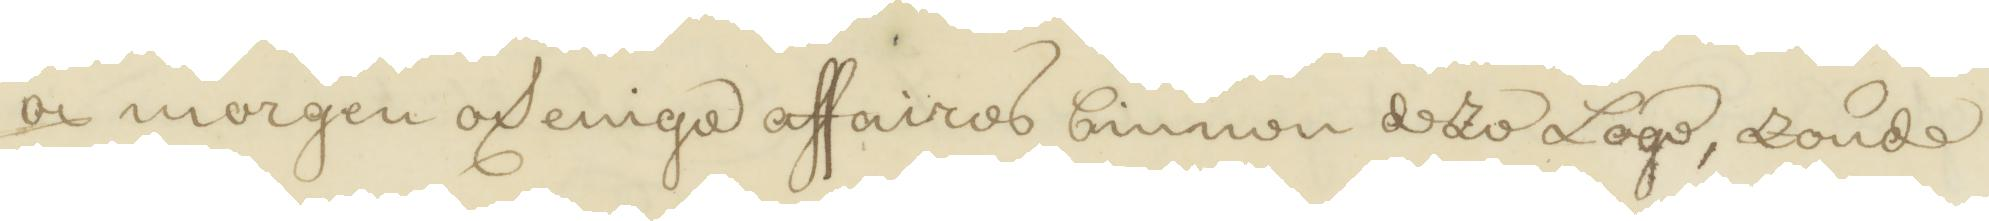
op morgen over enige affaires binnen deze Loge, zoude
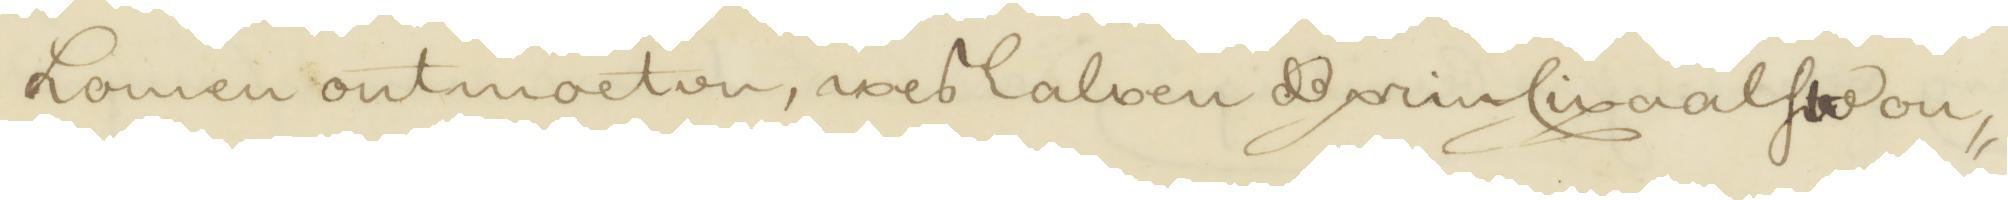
komen ontmoeten, weshalven de principaalste on„
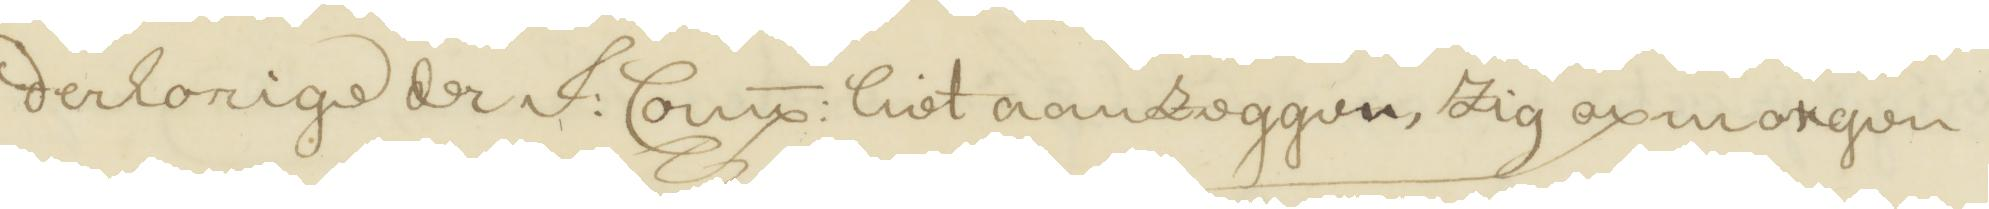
derhorige der S:Comp: liet aanzeggen, zig opmorgen
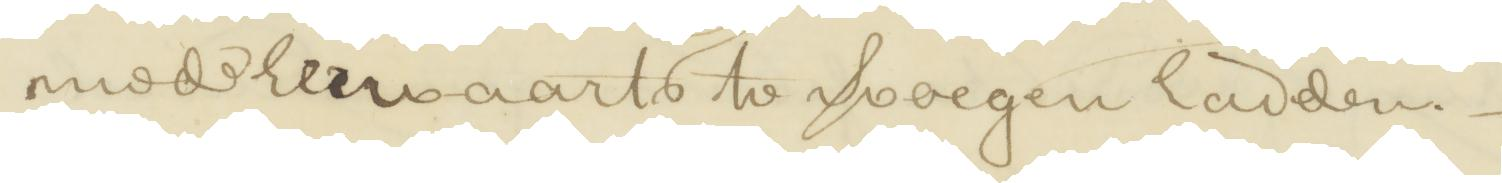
mede herwaarts te vervoegen hadden. — .
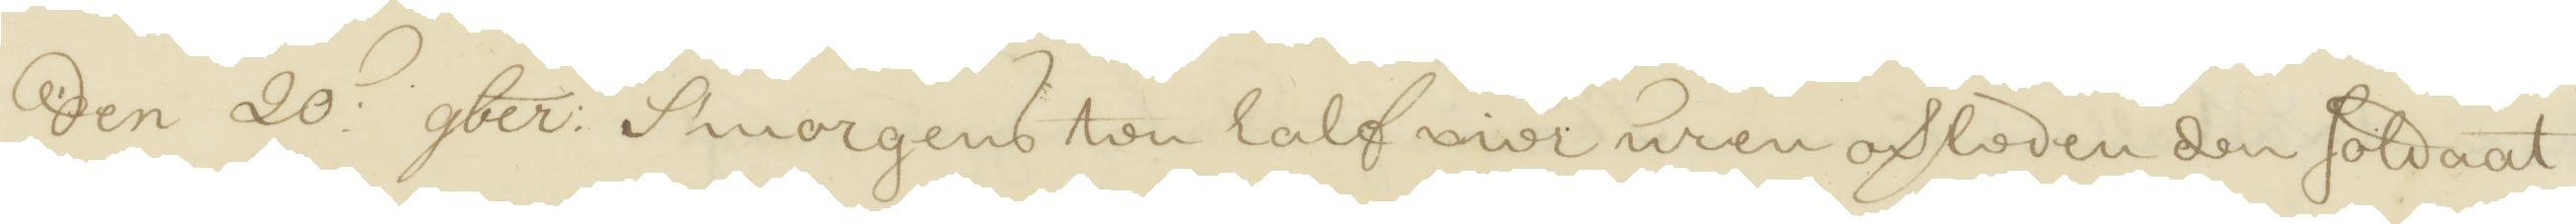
den 20:' 9ber: s'morgens ten half vier uren overleden den soldaat
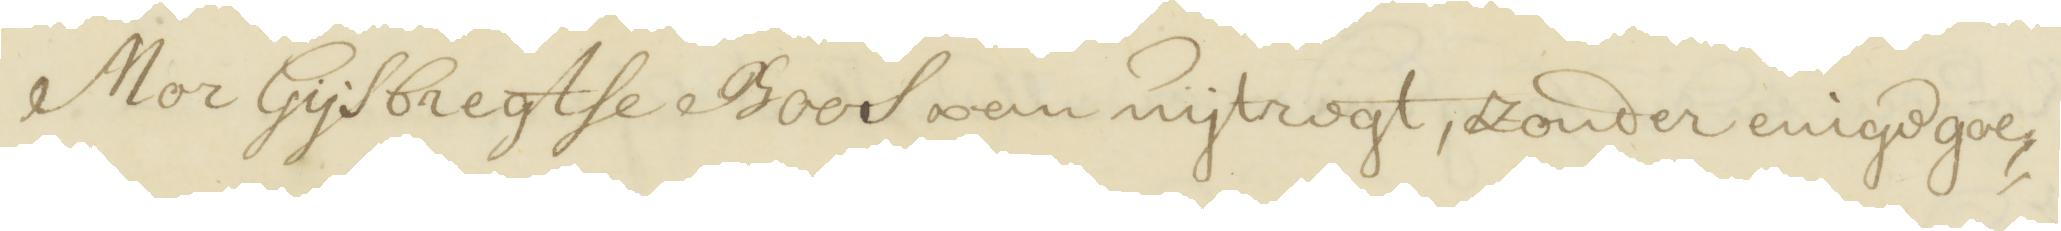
Mor Gijsbregtse Boos van uijtregt, zonder enige goe„
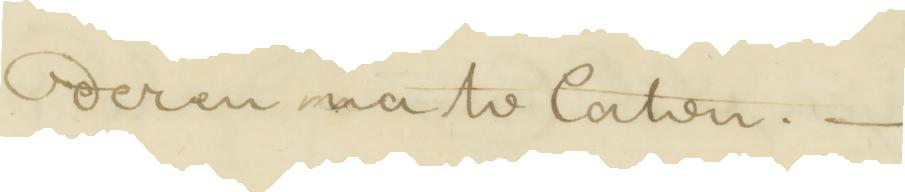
deren na te laten.
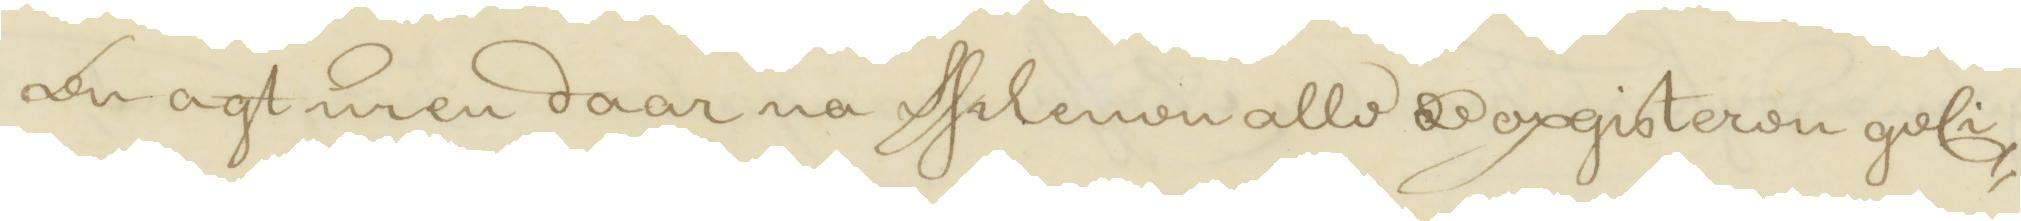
ten agt uren daar na verschenen alle de opgisteren geci„
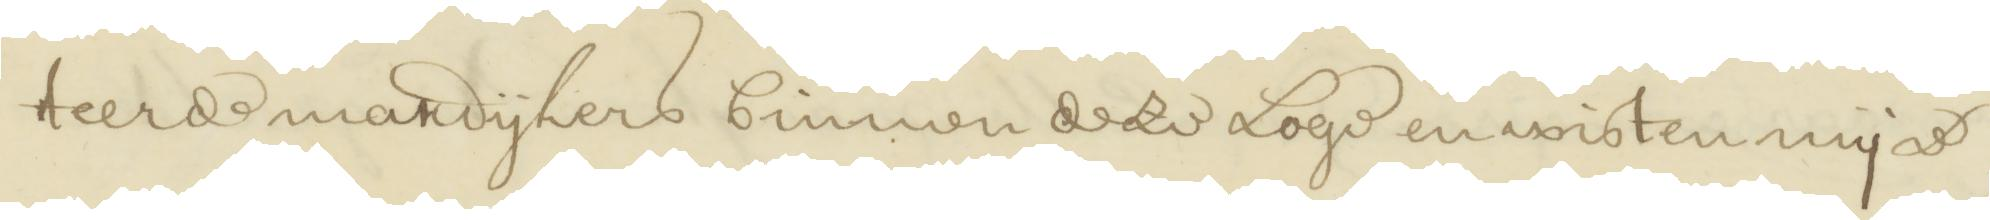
teerde mardijkers binnen deze loge en wisten mij te
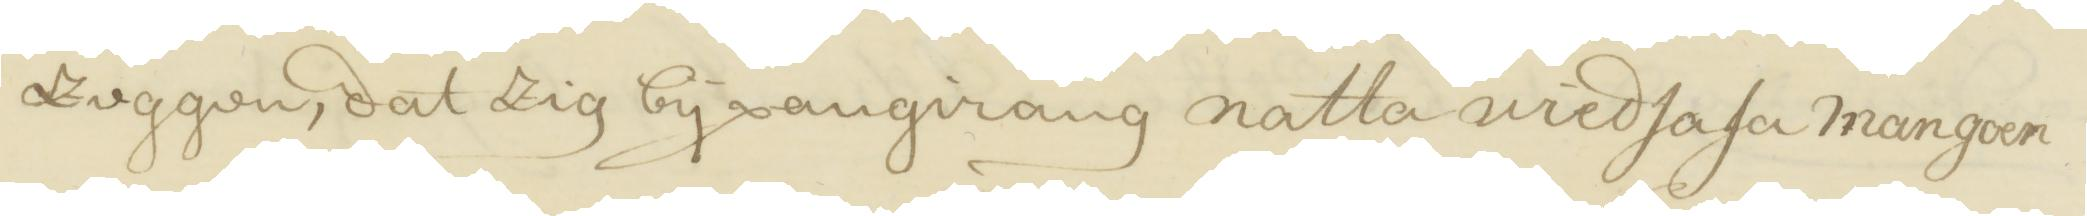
zeggen, dat zig bij pangirang natta wiedjaja mangoen
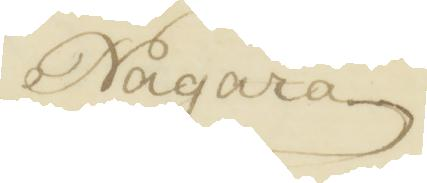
Nagara
